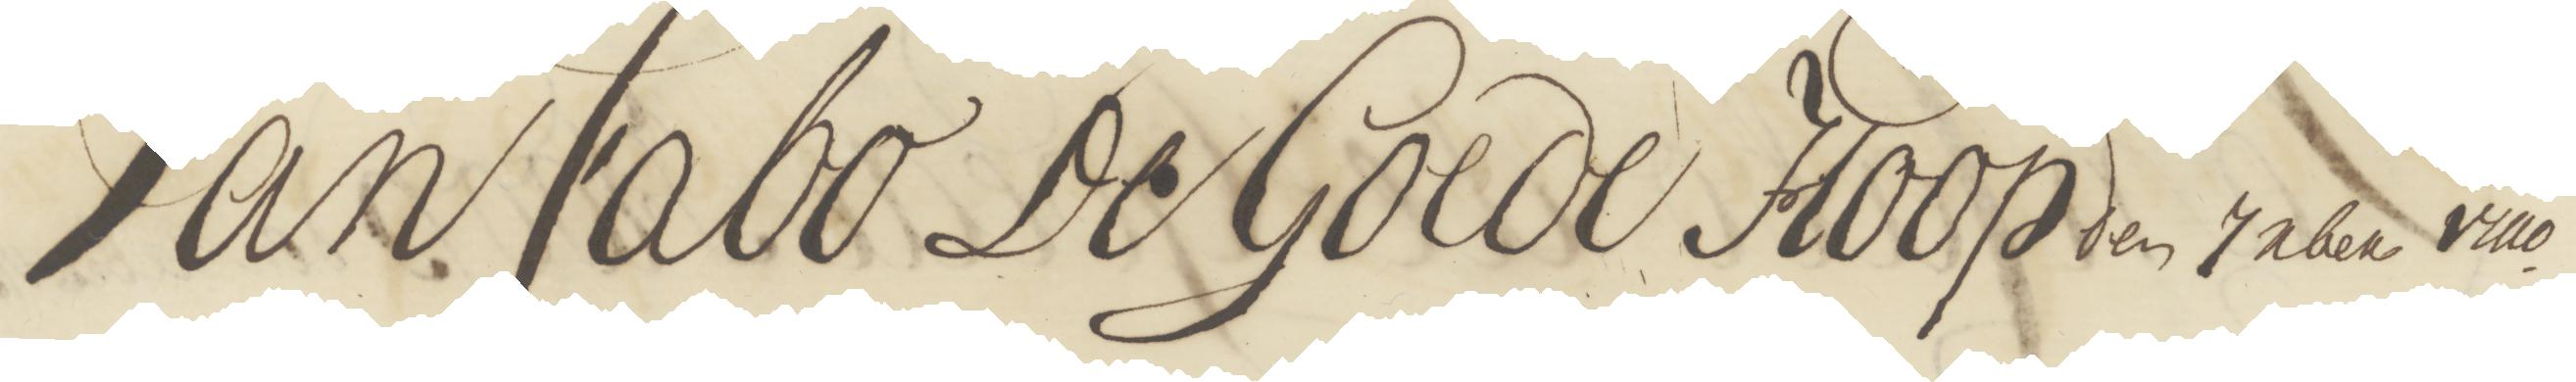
Van Cabo De Goede Hoop den 7 xber 1740
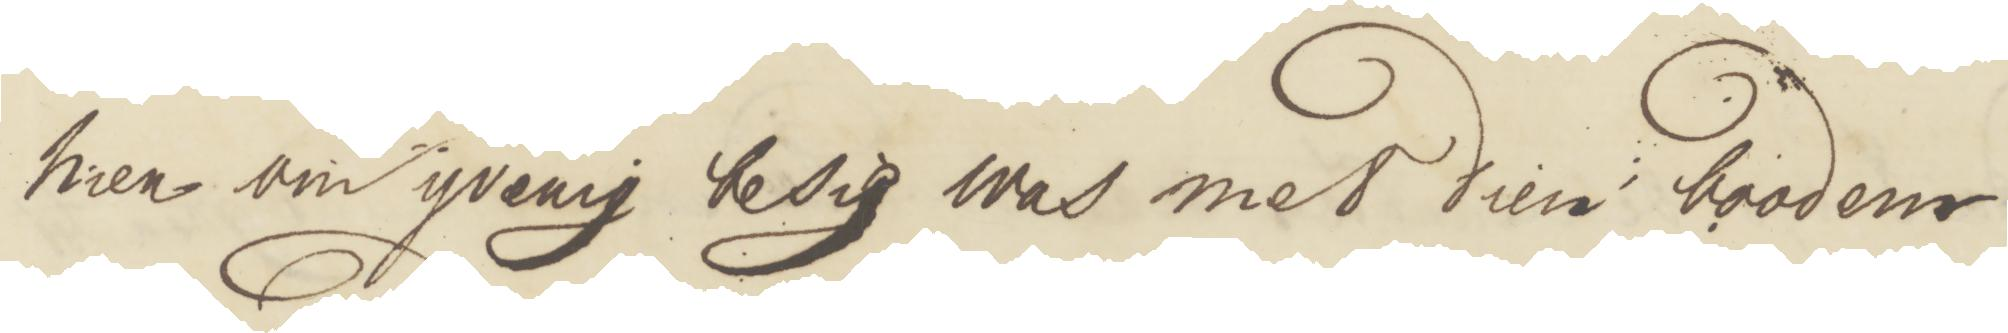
hier om ijverig besig was met dien boodem
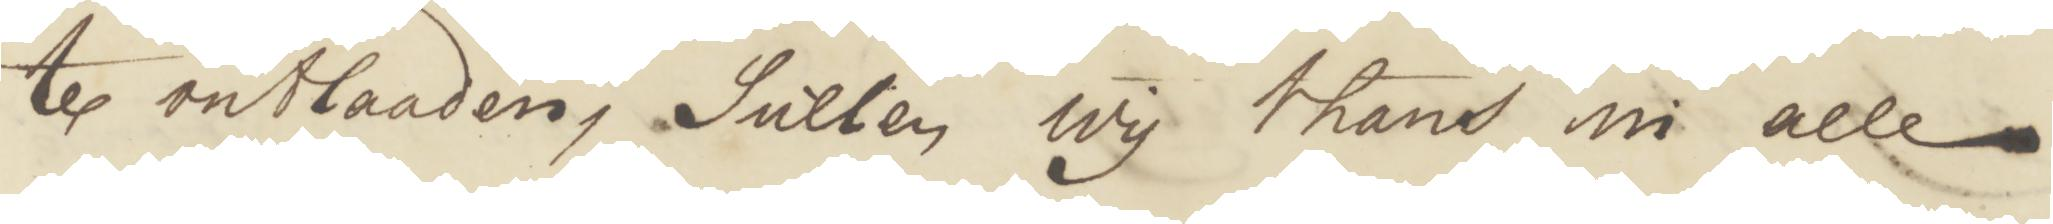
te ontlaaden, sullen wij thans in alle
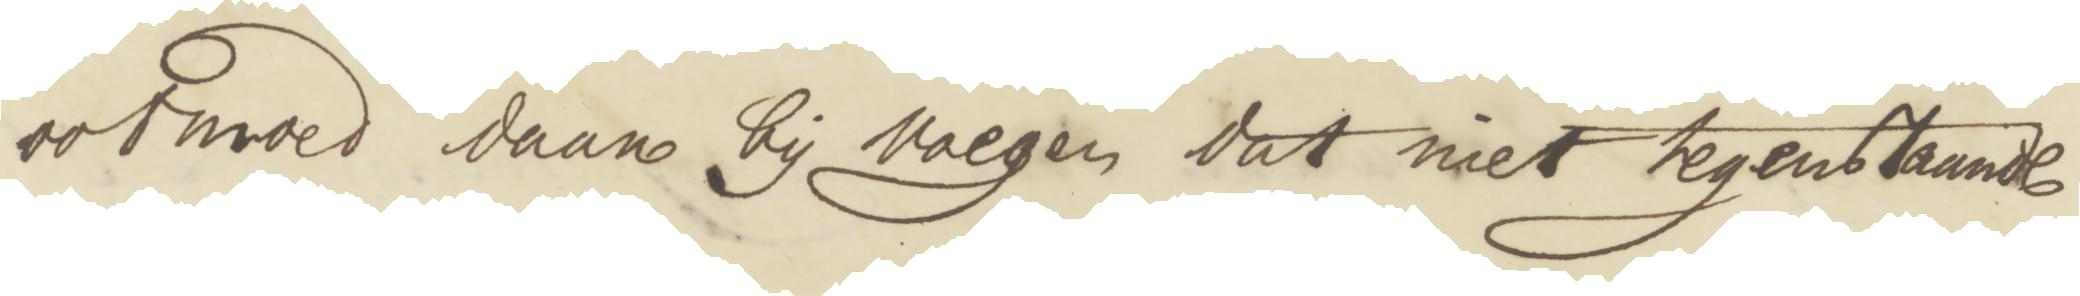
ootmoed daar bij voegen dat niet tegenstaande
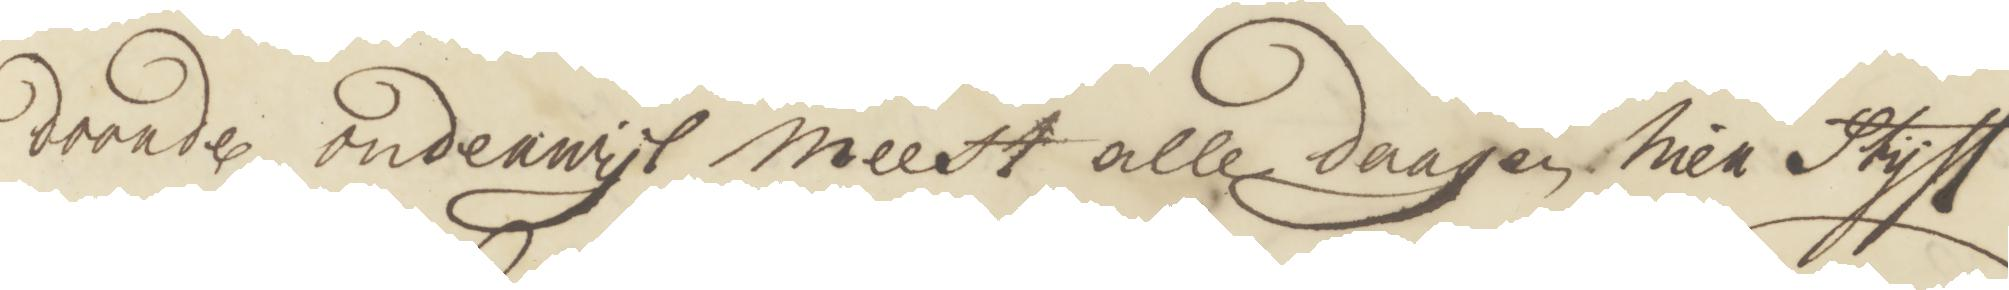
doorde onderwijl meest alle daagen hier stijff
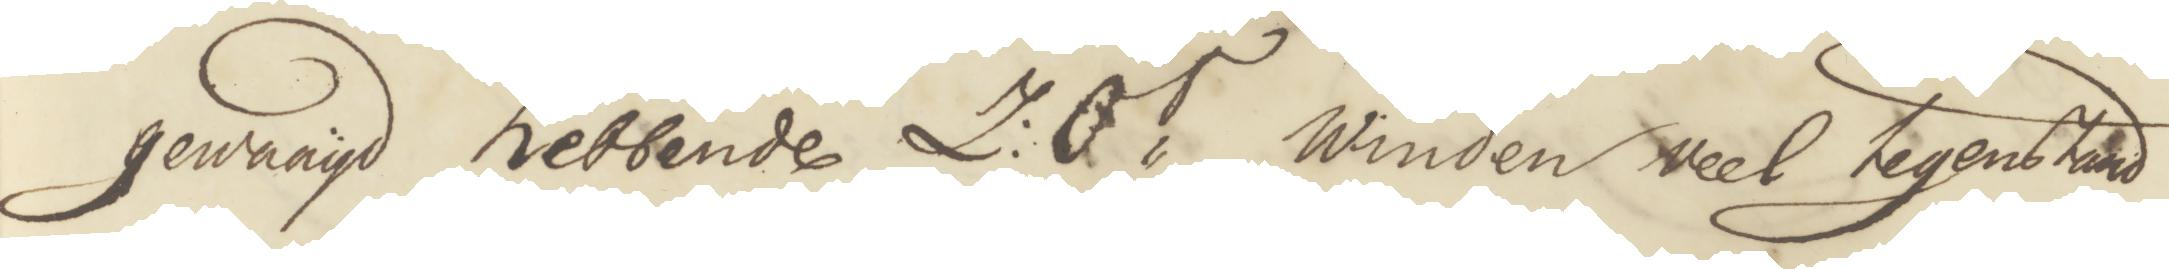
gewaaijd hebbende Z: O„t winden veel tegenstand
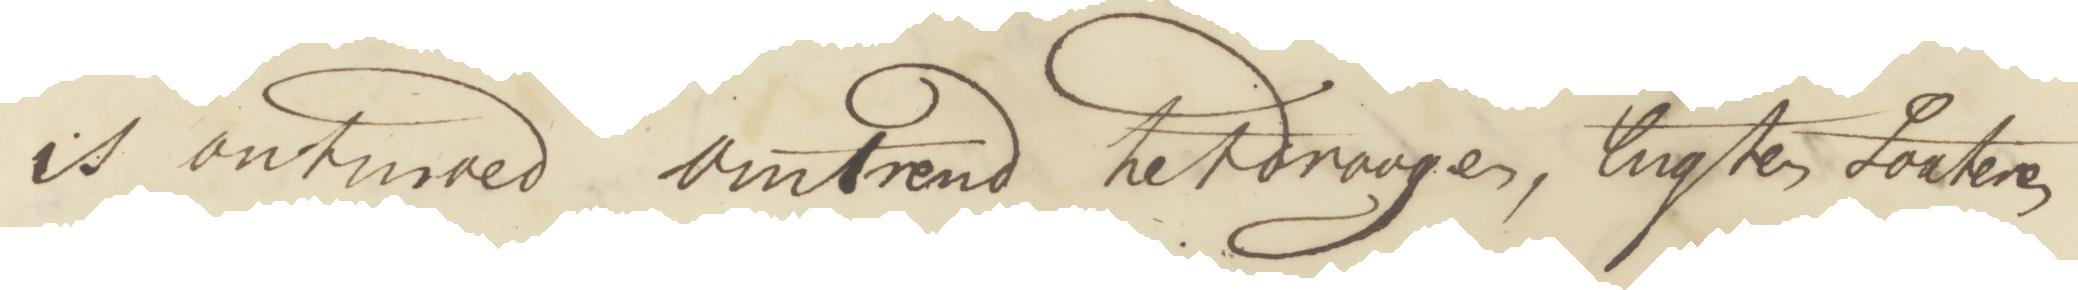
is ontmoed omtrend het draagen, lugten sorteren
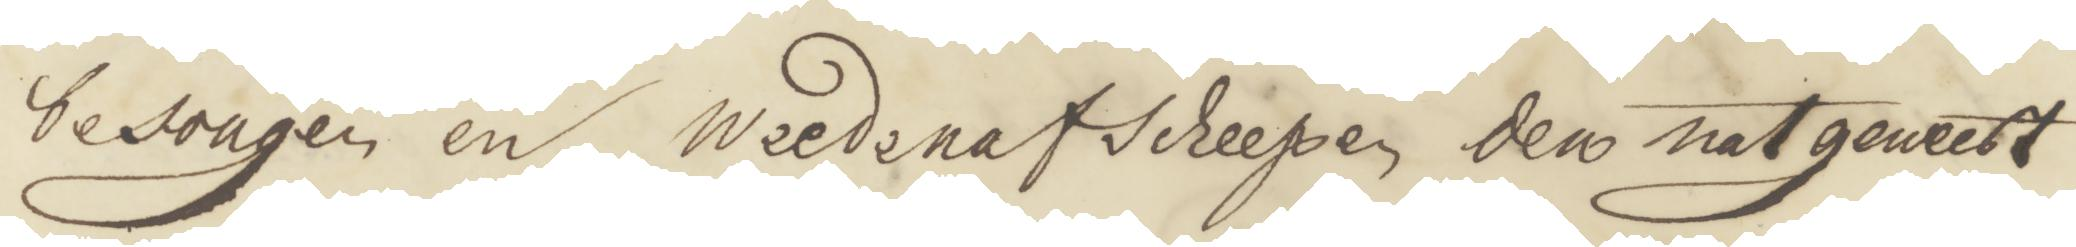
besorgen en weederafscheepen der nat geweest
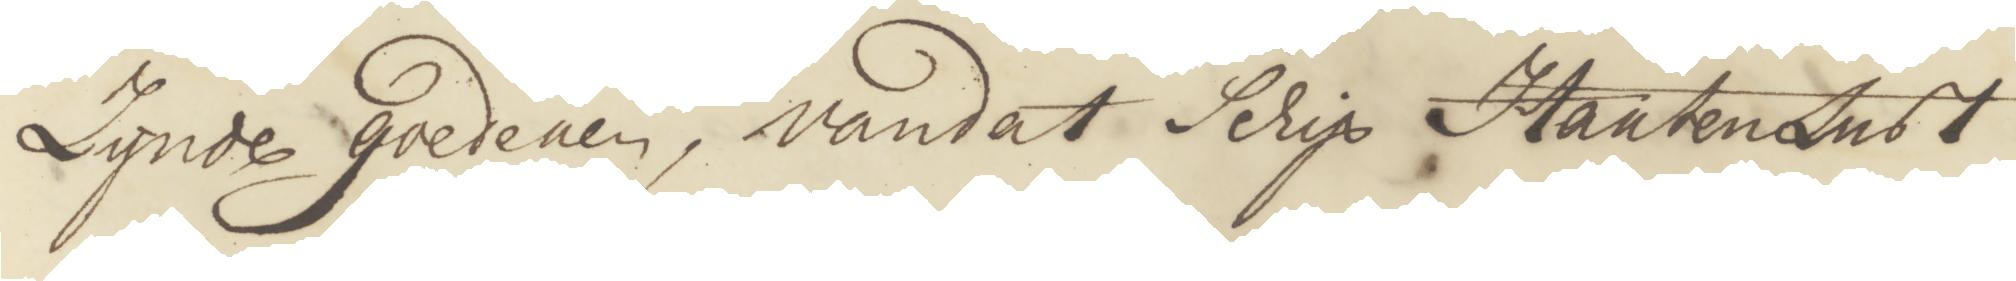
zijnde goederen, van dat schip Hartenlust
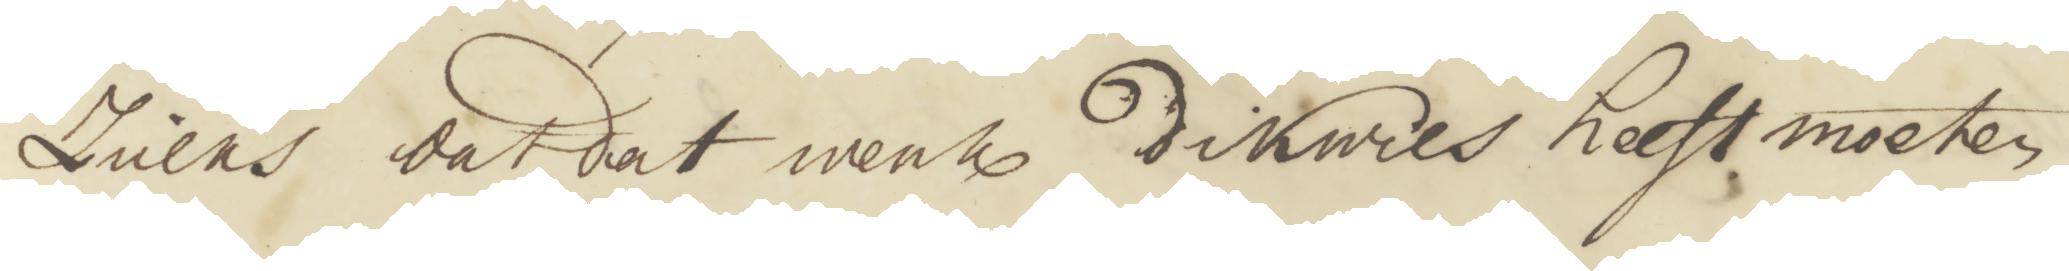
zulks dat dat werk dikwils heeft moeten
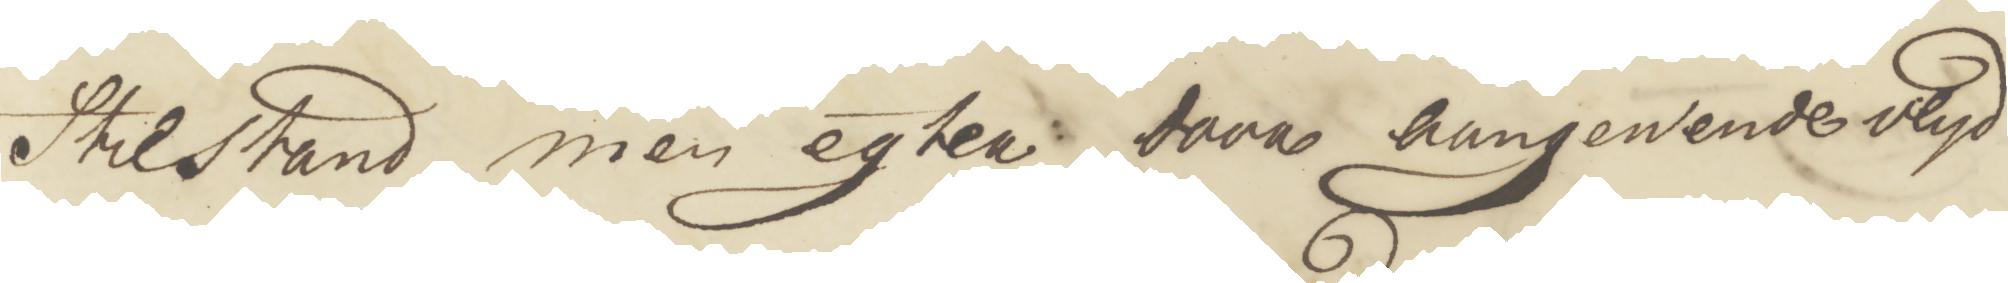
stilstand, men egter door aangewende vlyd
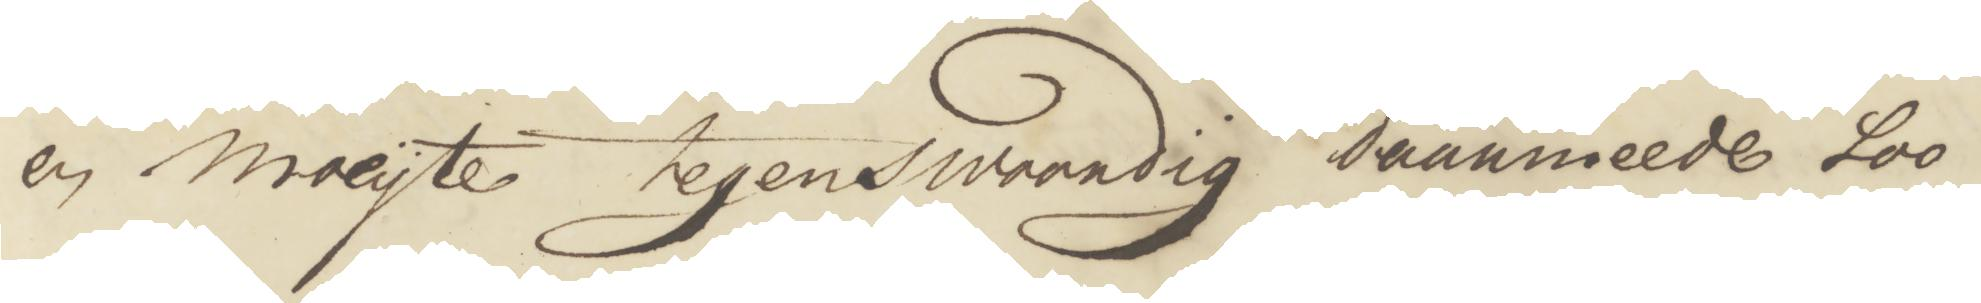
en moeijte tegenswoordig daarmeede soo
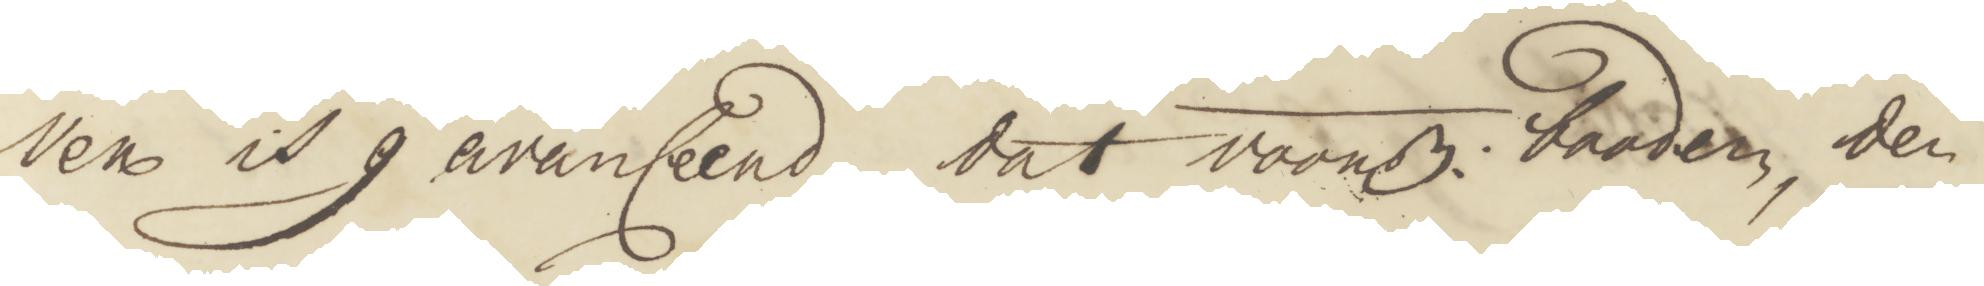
ver is g’avanceerd dat voorsz: boodem, den
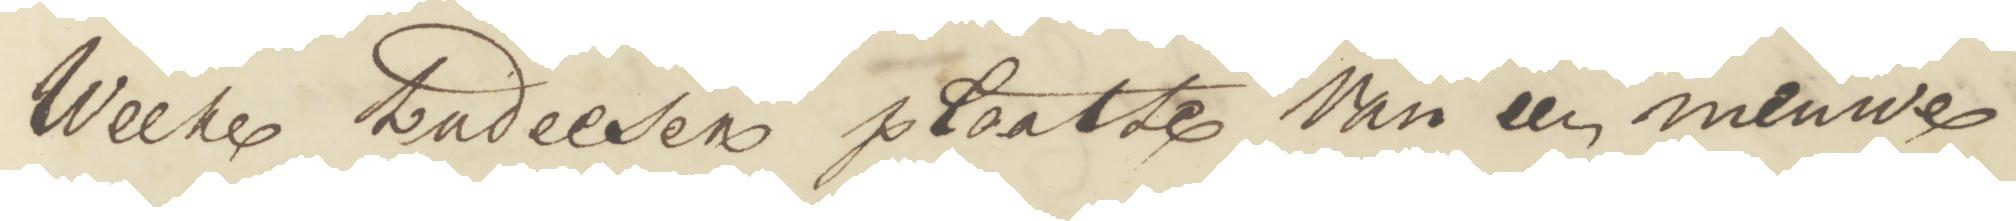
weeke ter deeser plaatse van een nieuwe
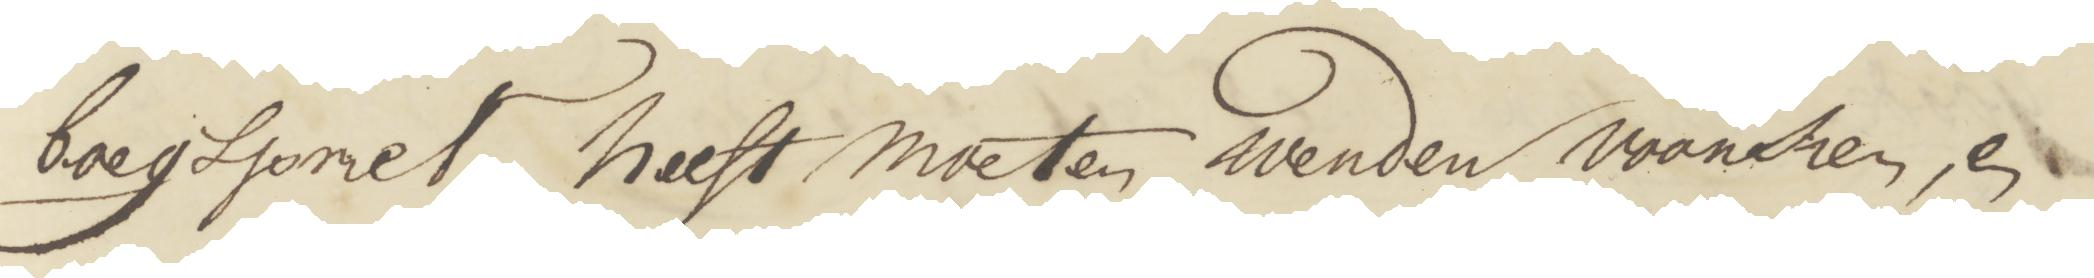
boegspriet heeft moeten werden voorsien, en
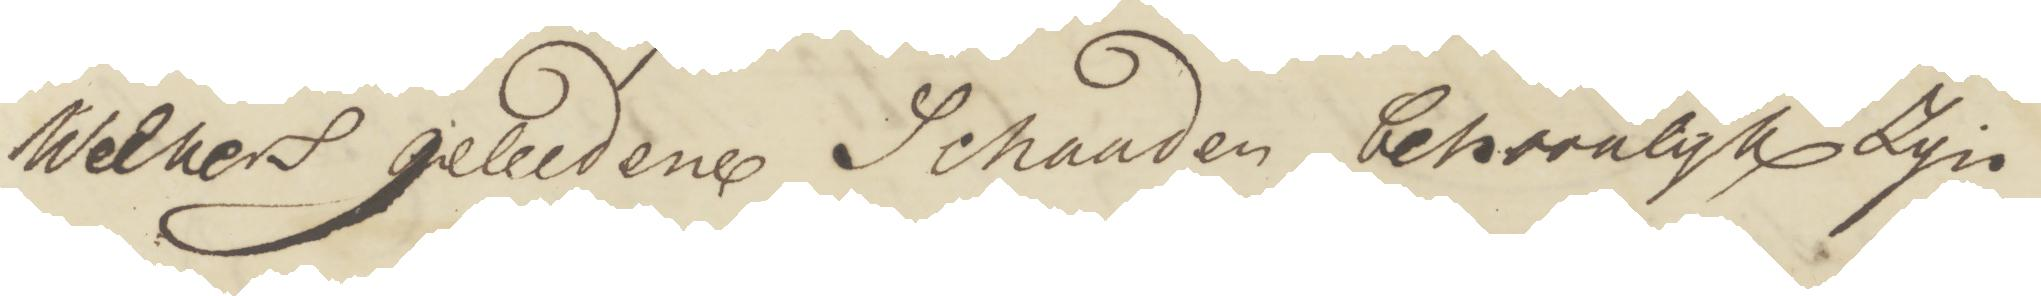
welkers geleedene schaaden behoorlijk zijn
